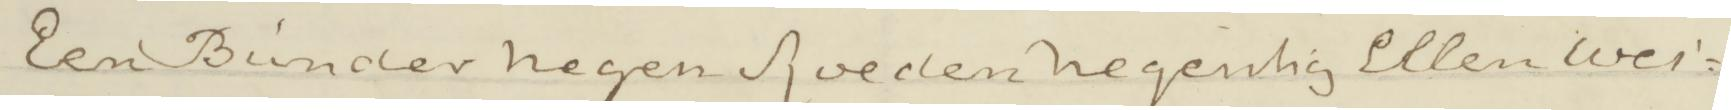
Een Bunder negen Roeden negentig Ellen wei=
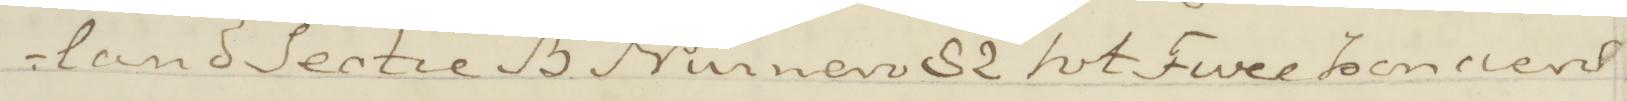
=land Sectie B Numero 82 tot Twee honderd
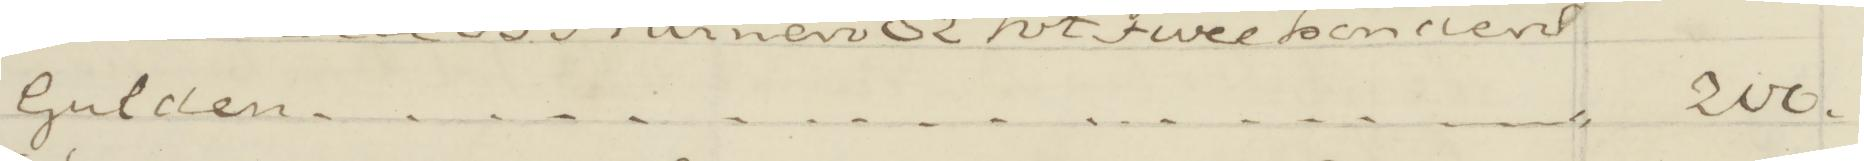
Gulden - - - - - - - - - - - - - - - - - - - „ 200„
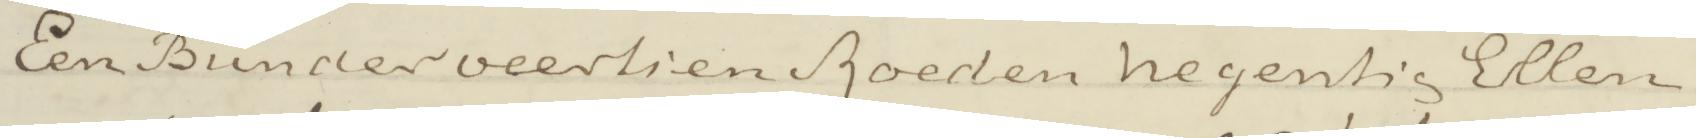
Een Bunder veertien Roeden negentig Ellen
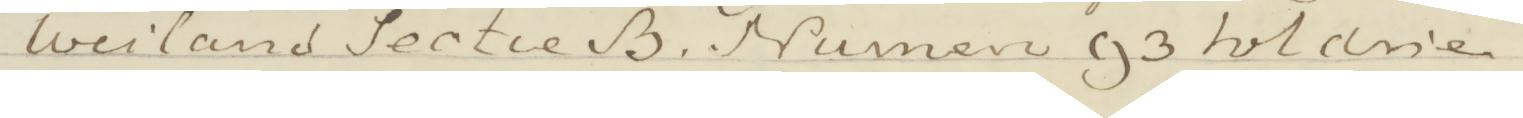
weiland Sectie B. Numero 93 tot drie
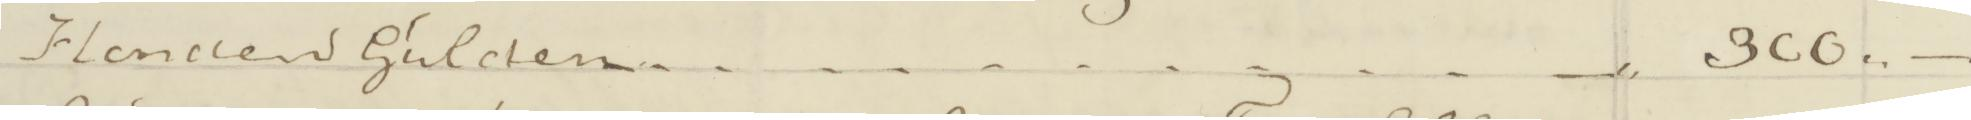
Honderd Gulden - - - - - - - - - - - „ 300„ —
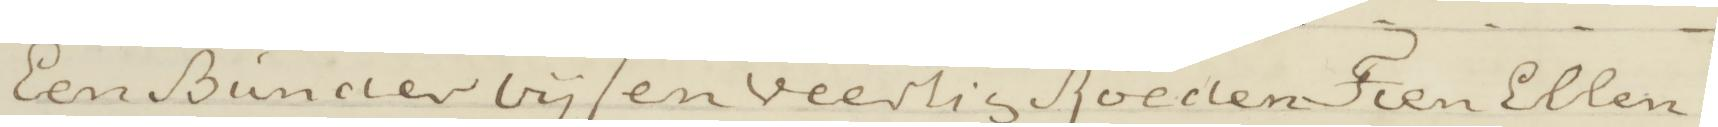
Een Bunder vijf en veertig Roeden Tien Ellen
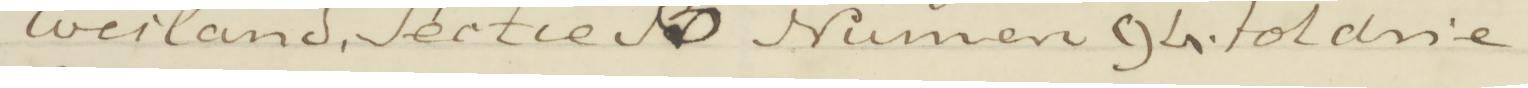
weiland, Sectie B Numero 94. tot drie
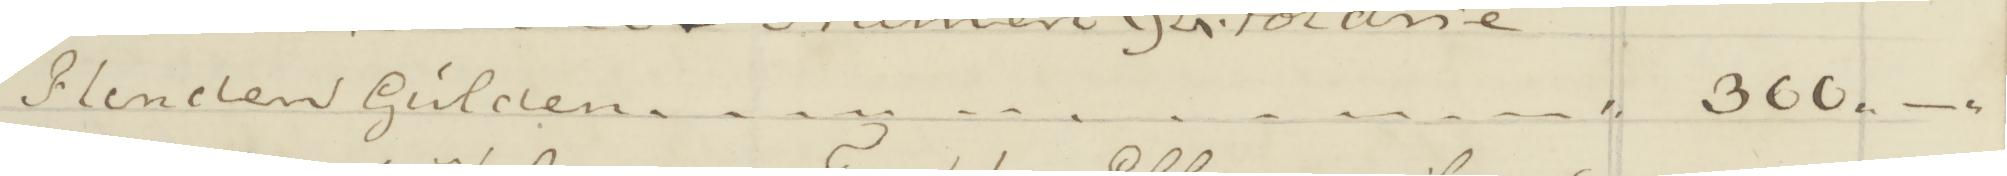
Honderd Gulden - - - - - - - - - - - - - - - „ 300„ —„
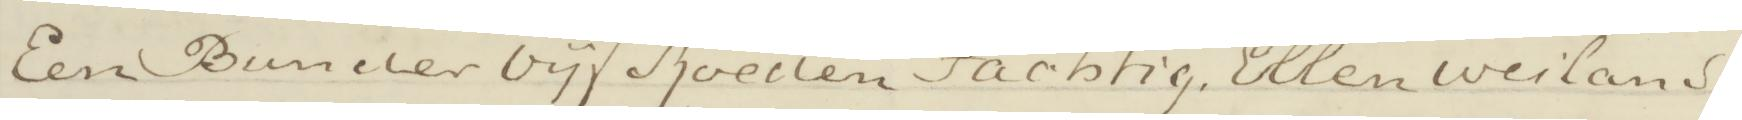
Een Bunder vijf Roeden Tachtig, Ellen weiland
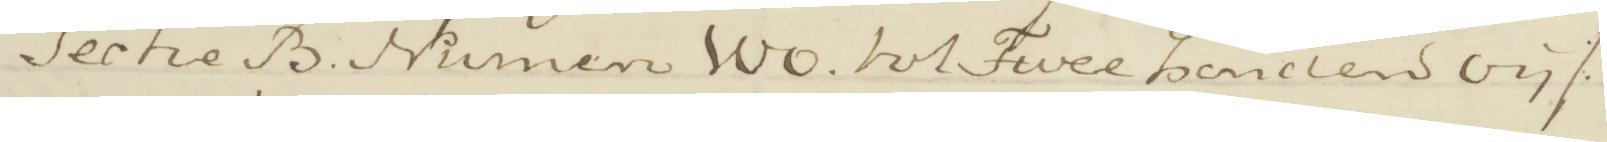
Sectie B. Numero 100. tot Twee honderd vijf
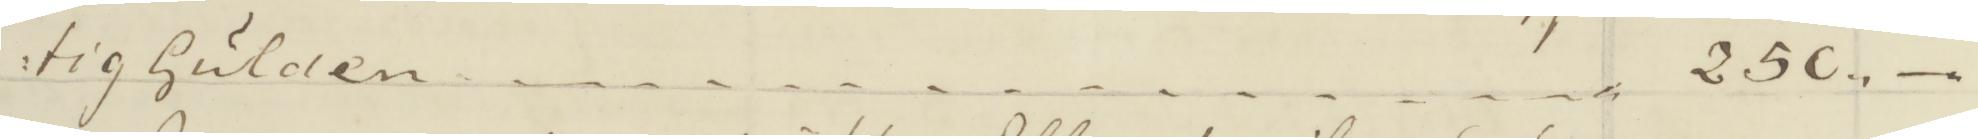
:tig Gulden - - - - - - - - - - - - - - - „ 250„ —
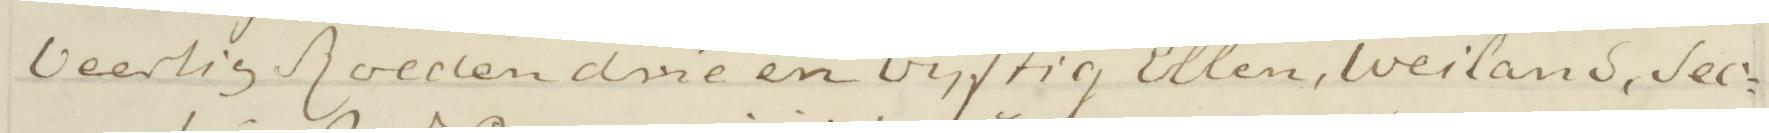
Veertig Roeden drie en vijftig Ellen, weiland, Sec=
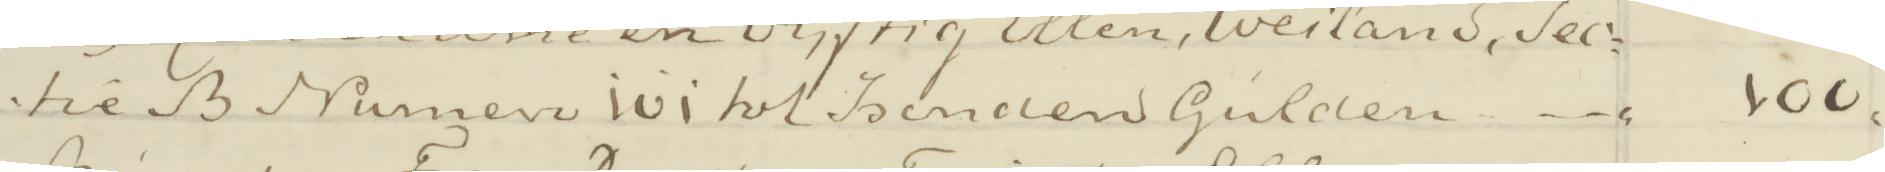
:tie B Numero 101 tot honderd Gulden - - - „ 100
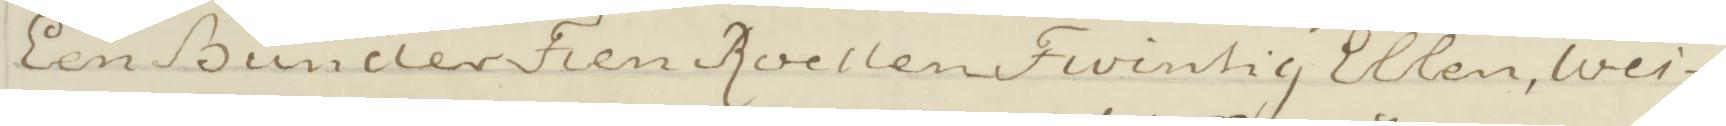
Een Bunder Tien Roeden Twintig Ellen, Wei=
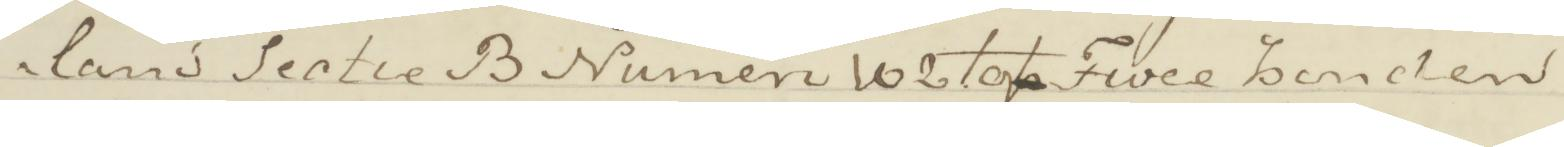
=land Sectie B Numero 102 tot Twee honderd
